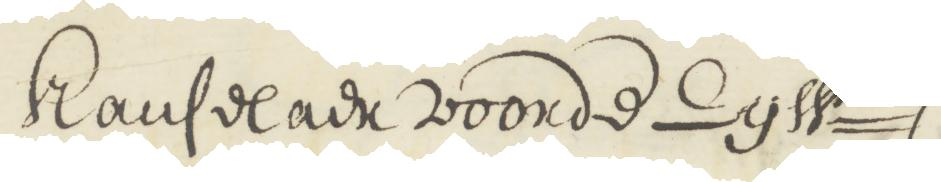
Kanselaer voorde Eijss=rce
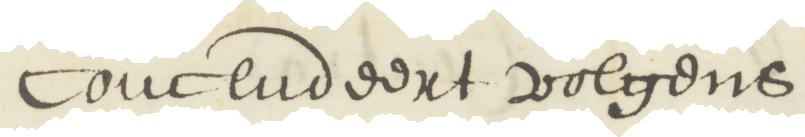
concludeert volgens
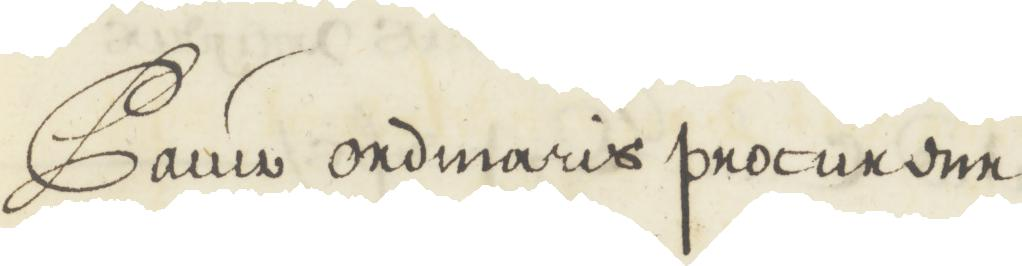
Pauw ordinaris procureur
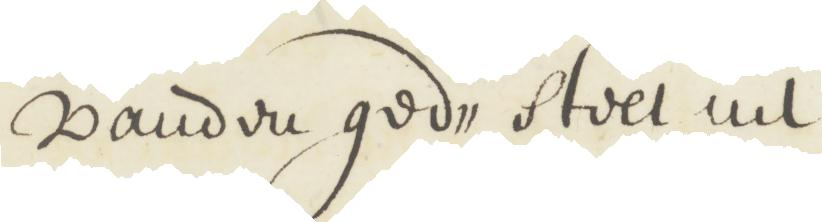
vanden ged„e stelt int
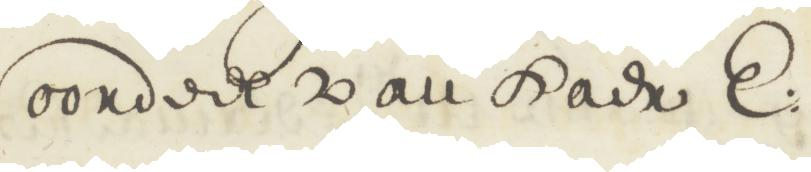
oordeel van haer E:
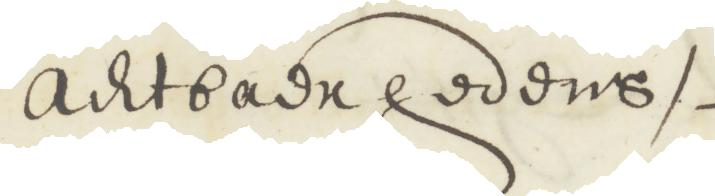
achtbaer hedens/
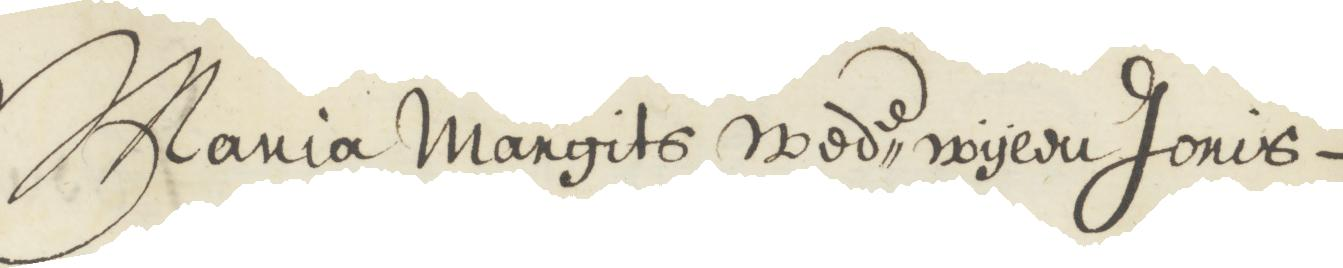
Maria Margits wed„e wijlen Joris —
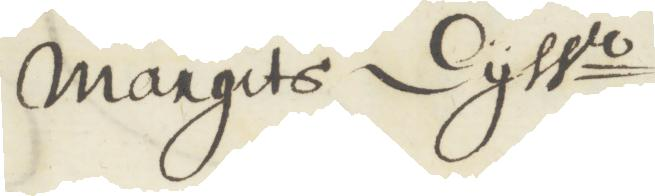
margits Eijss=r
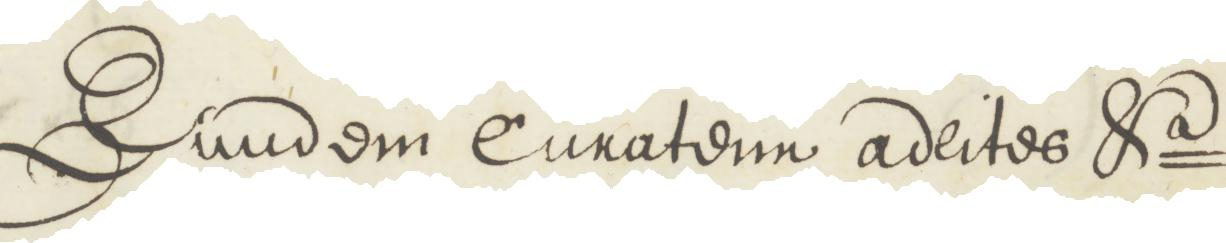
Eundem curateur adlites &=a
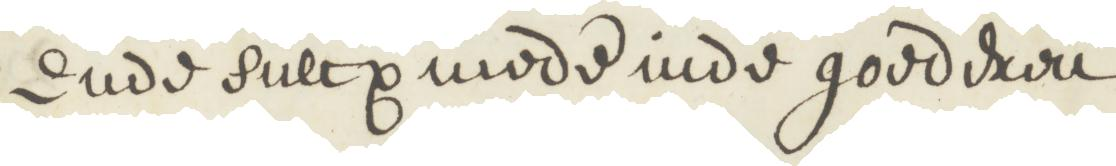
Ende sulcx mede inde goederen
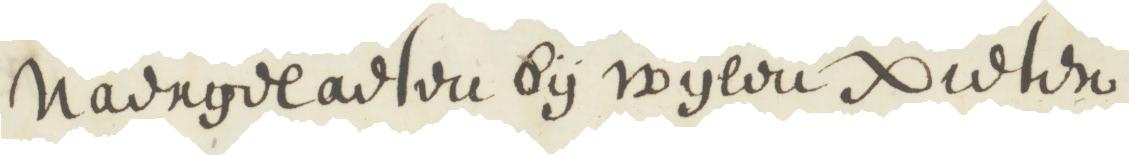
naergelaeten bij wijlen pieter
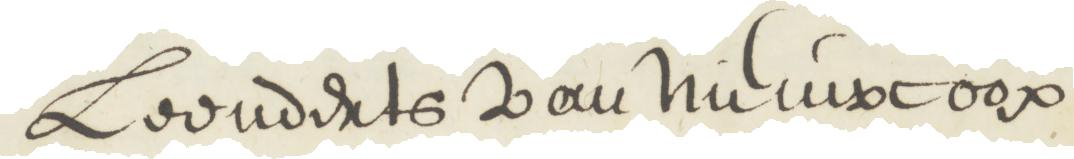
Leenderts van nieuwcoop
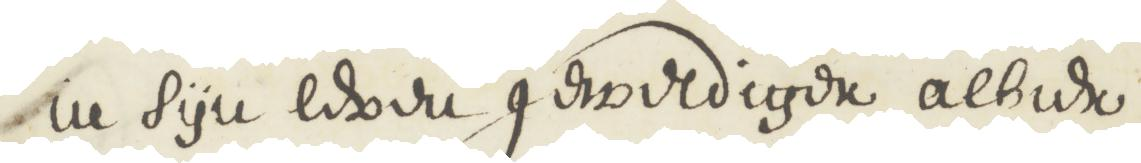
in sijn leven geweldiger alhier
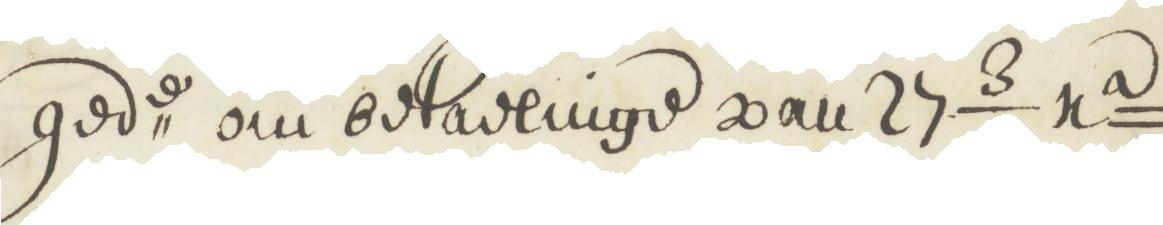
ged„e om betaelinge van 27¾ r=a
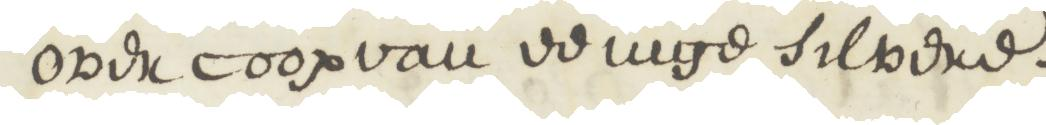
over coop van eenige silvere
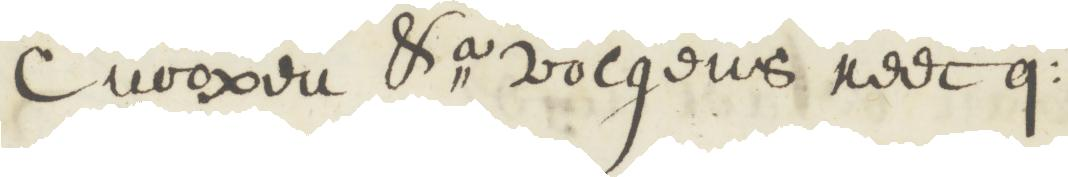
cnoopen &„a volgens reecq:
